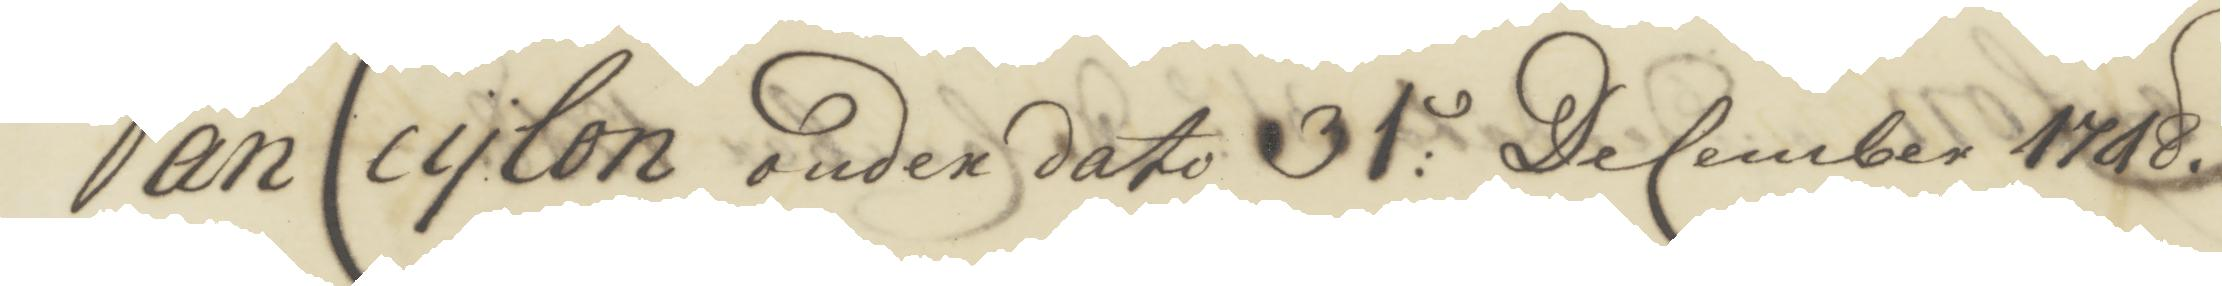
Van Ceijlon onder dato 31:e December 1748.
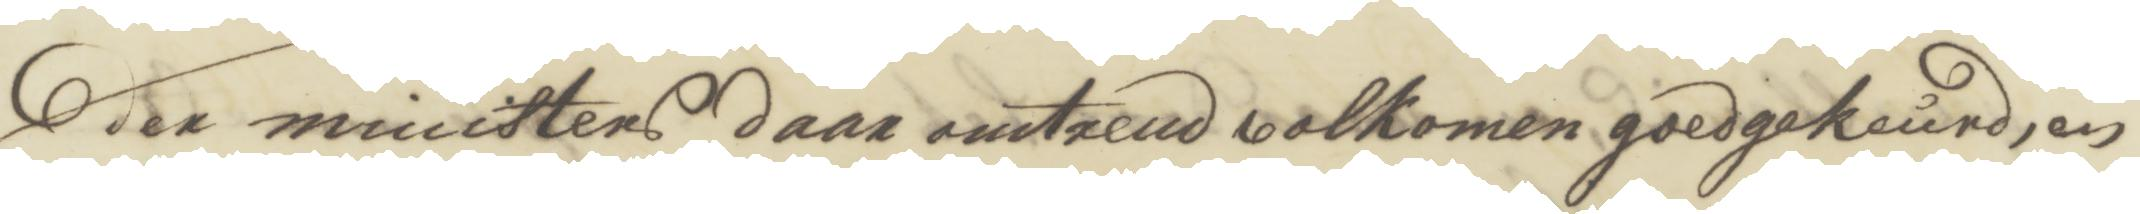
der ministers daar omtrend volkomen goedgekeurd, en
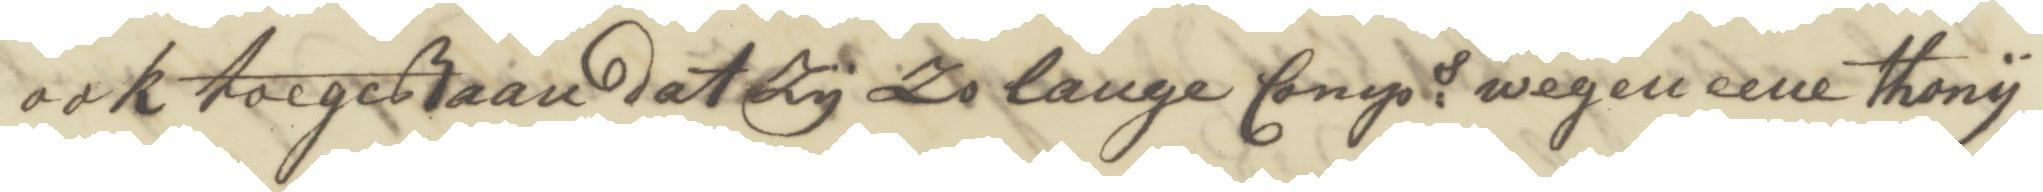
ook toegestaan dat zij zo lange Comp:s wegen eene thonij
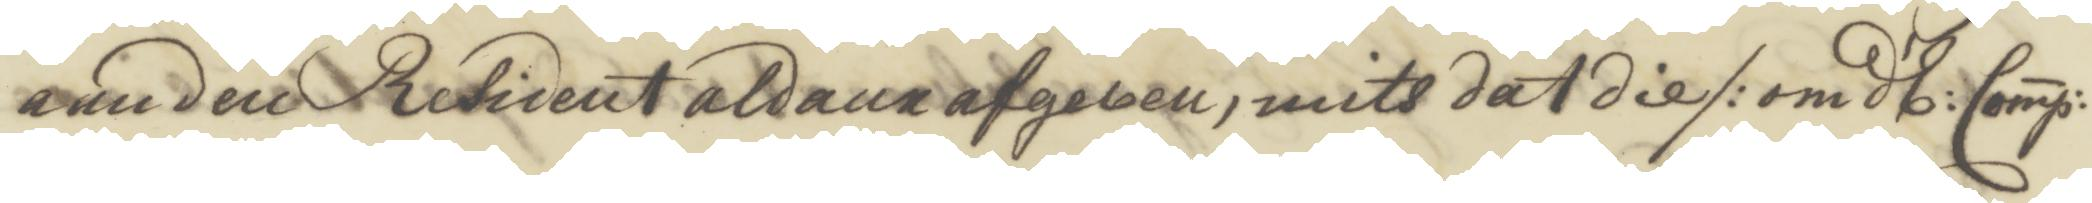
aan den Resident aldaar afgeven, mits dat die /: om d'E: Comp:
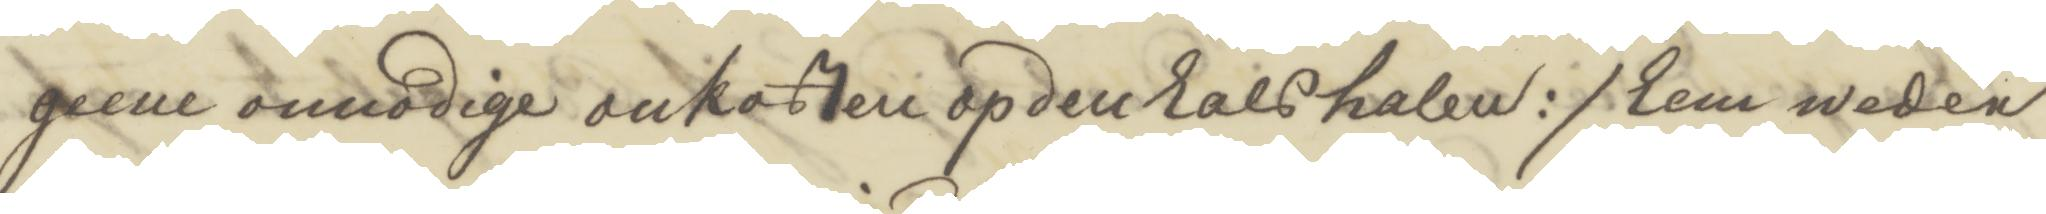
geene onnodige onkosten op den hals halen :/ hem weder
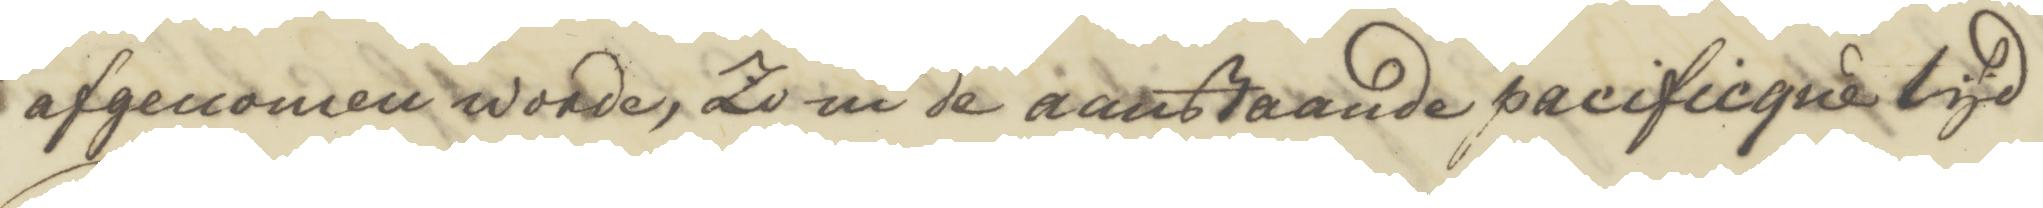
afgenomen worde, zo in de aanstaande pacificque tijd
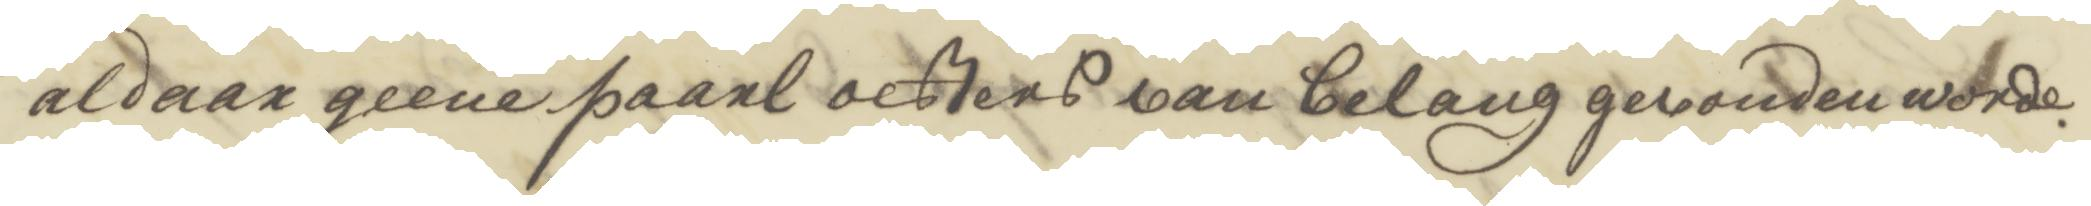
aldaar geene paarl oesters van belang gevonden worde.
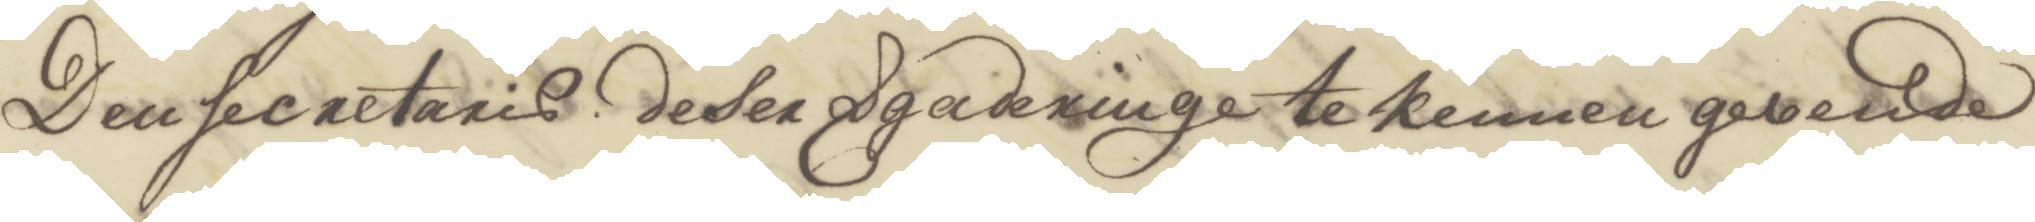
Den secretaris deser vergaderinge te kennen gevende
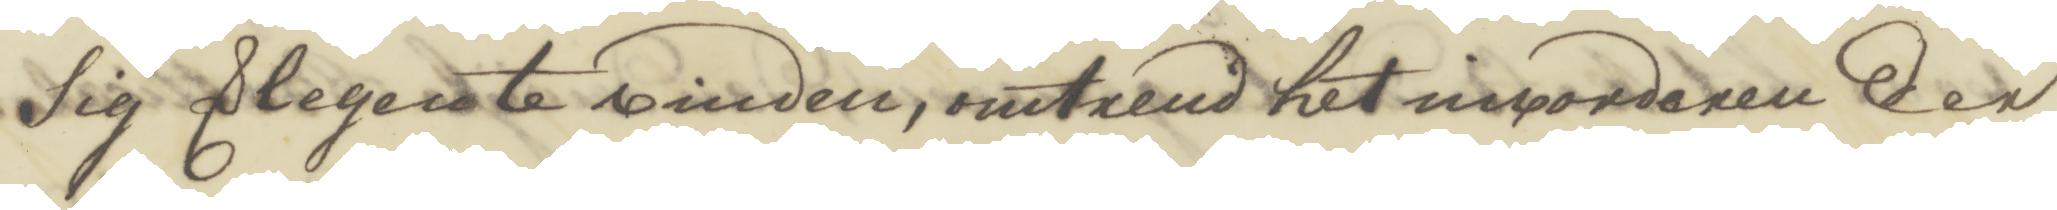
sig verlegen te vinden, omtrend het invorderen der
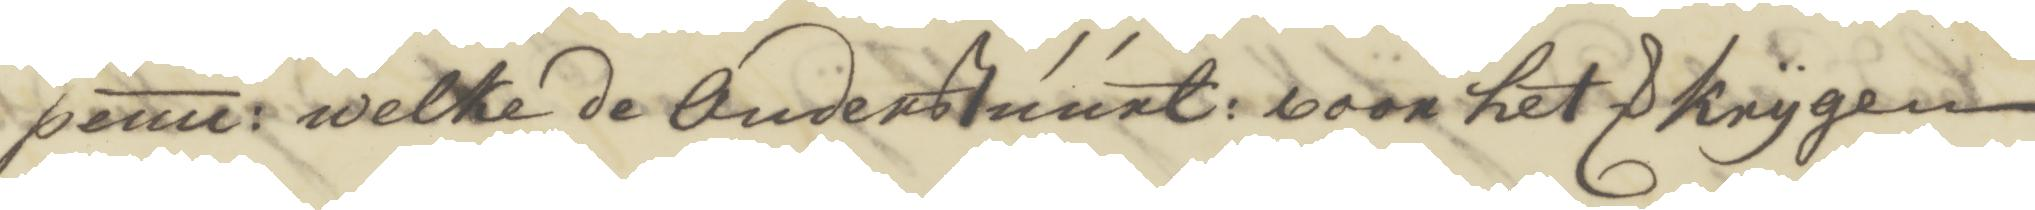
penn: welke de Onderstuurl: voor het verkrijgen
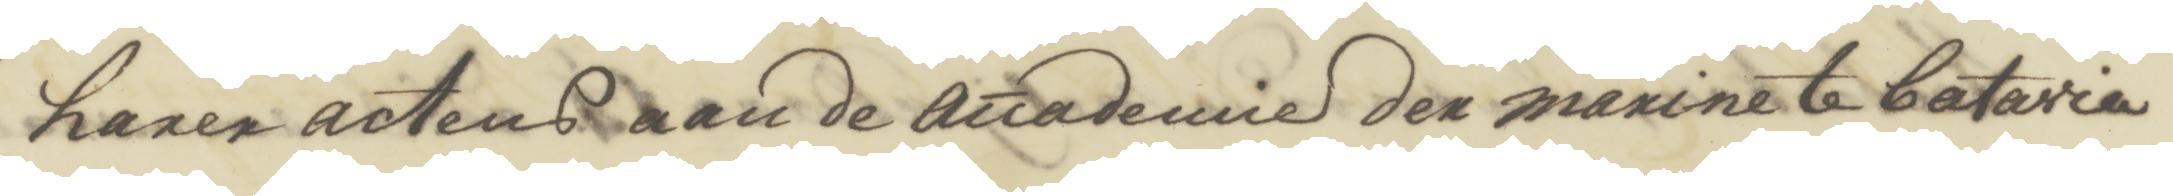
harer actens aan de accademie der marine te batavia
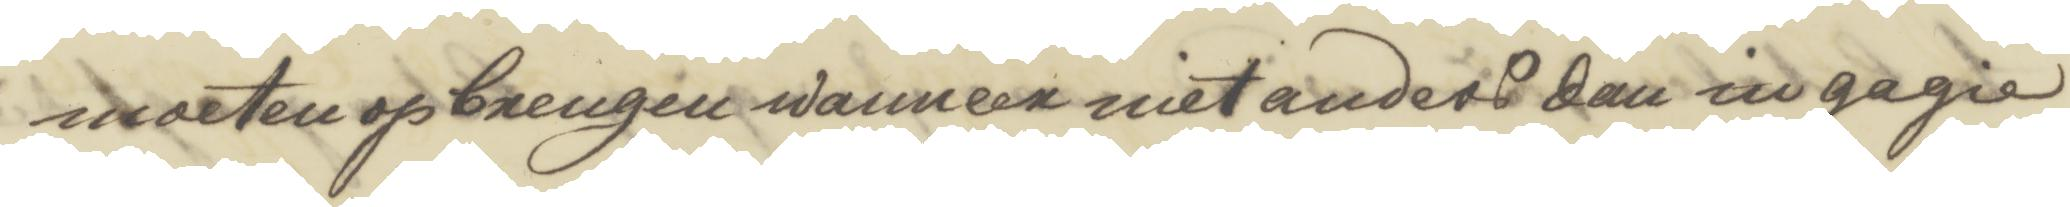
moeten op brengen wanneer niet anders dan in gagie
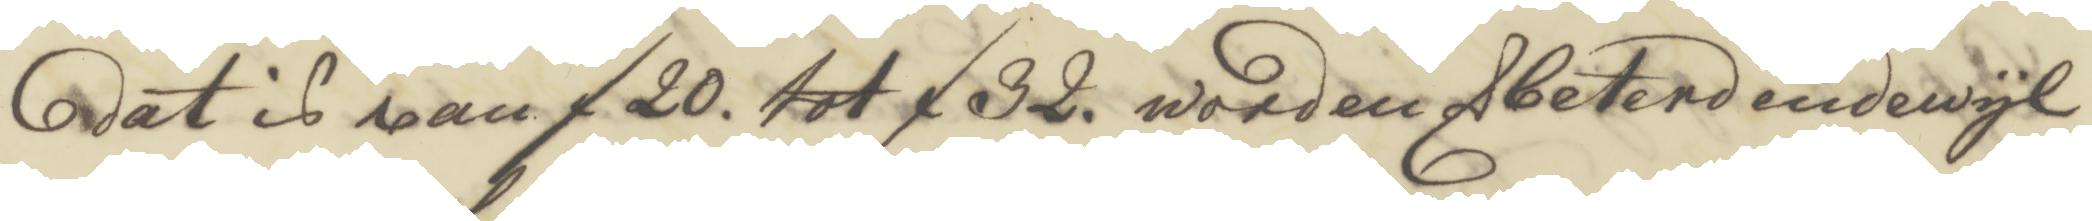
dat is van ƒ20. tot ƒ32. worden verbeterd en dewijl
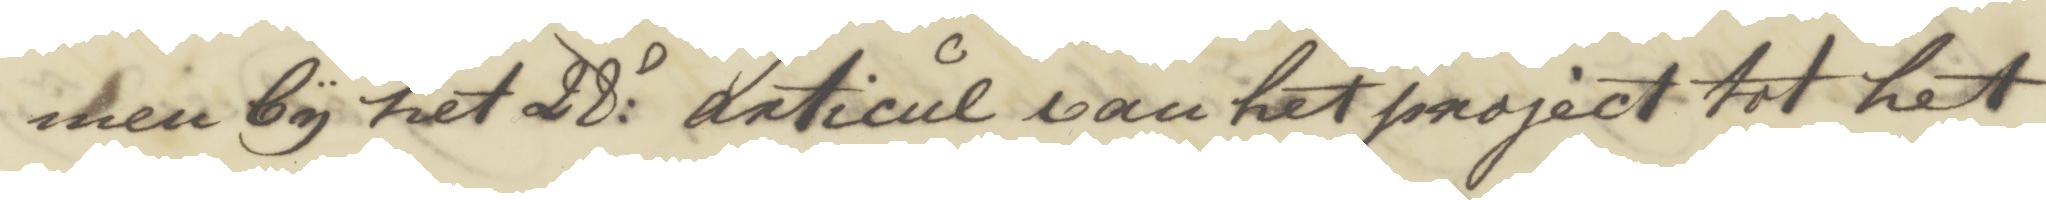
men bij het 28:' articul van het project tot het
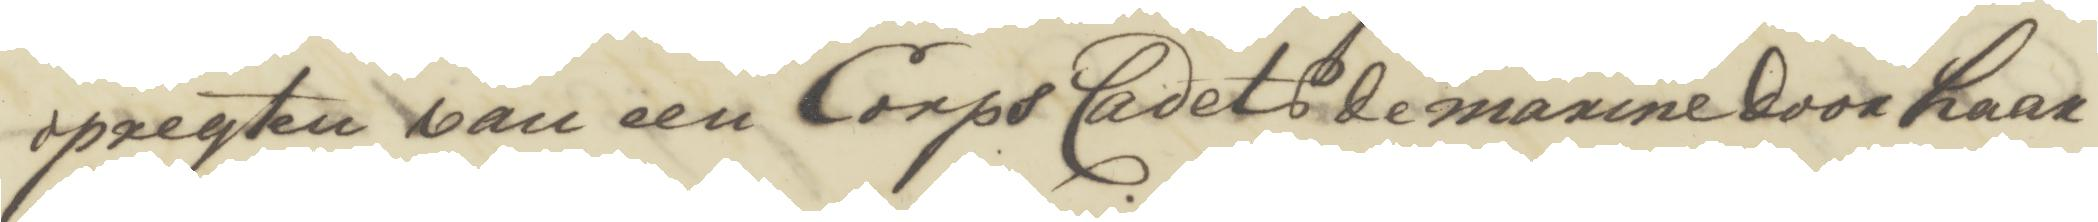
opregten van een Corps Cadets de marine door haar
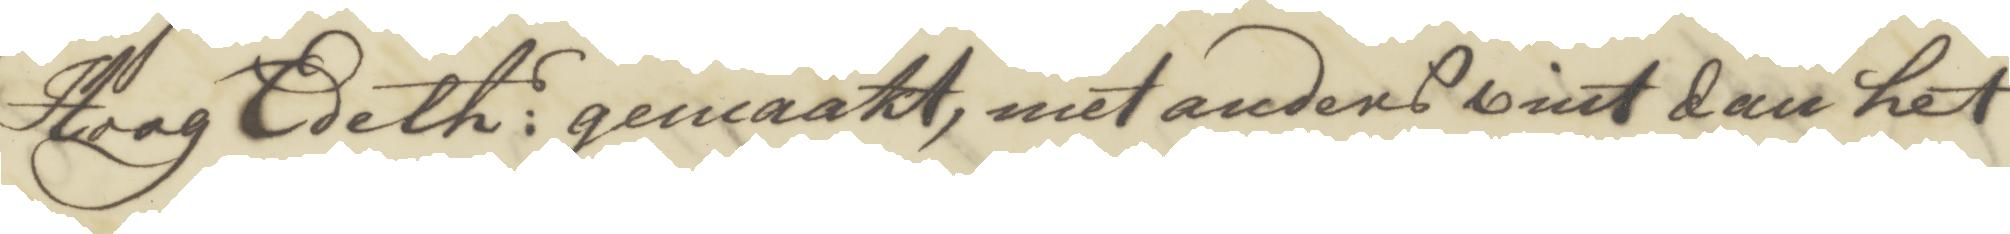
Hoog Edelh:s gemaakt, niet anders vint dan het
